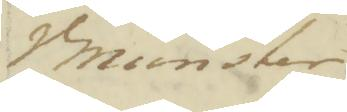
V munster
